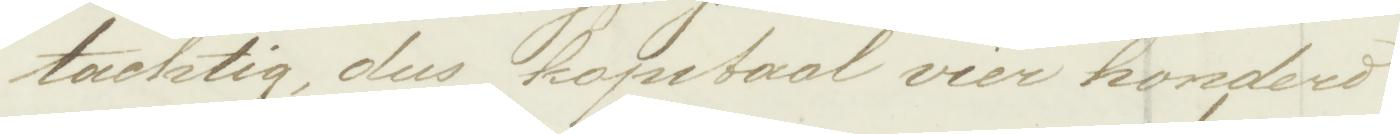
tachtig, dus kapitaal vier honderd
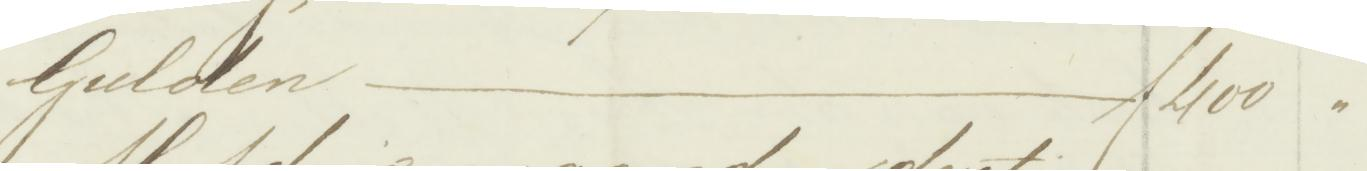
Gulden —ƒ400 „
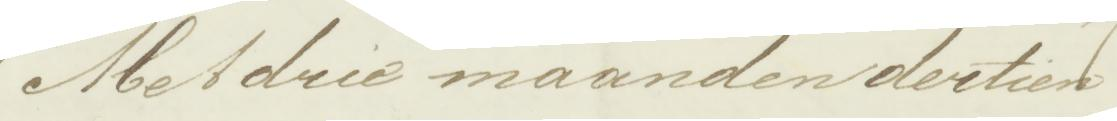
Met drie maanden dertien
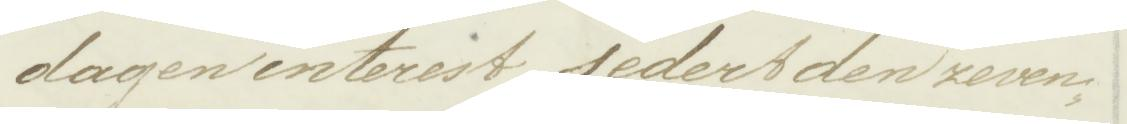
dagen interest sedert den zeven„
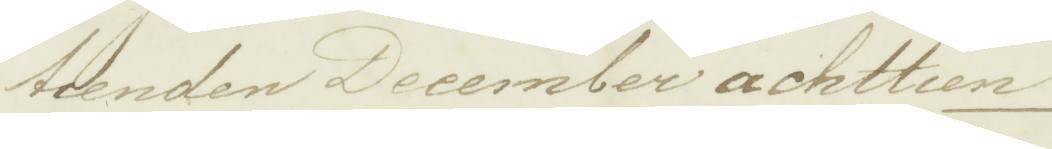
tienden December achttien
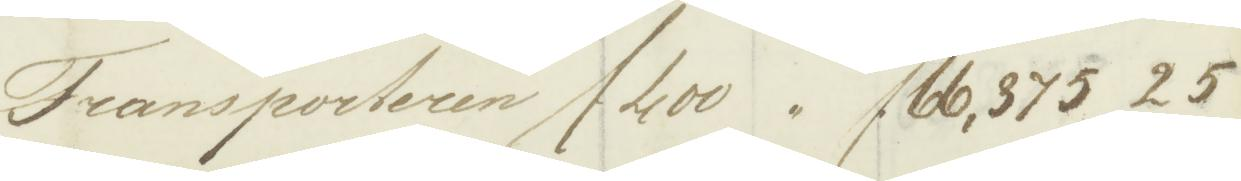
Transporteren ƒ 400 „ ƒ66„375 25
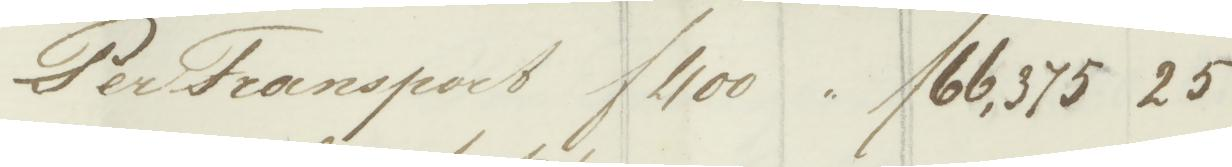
Per Transport ƒ 400 ƒ66,375 25
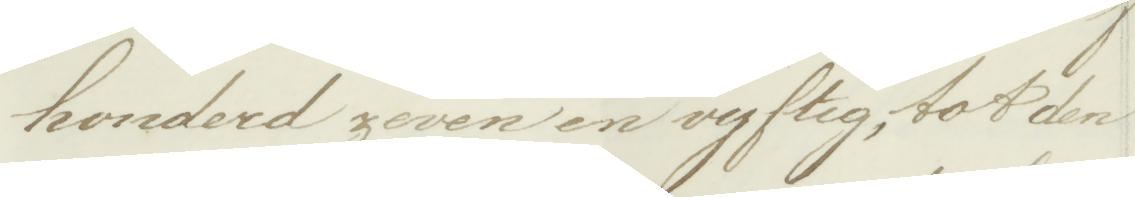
honderd zeven en vyftig, tot den
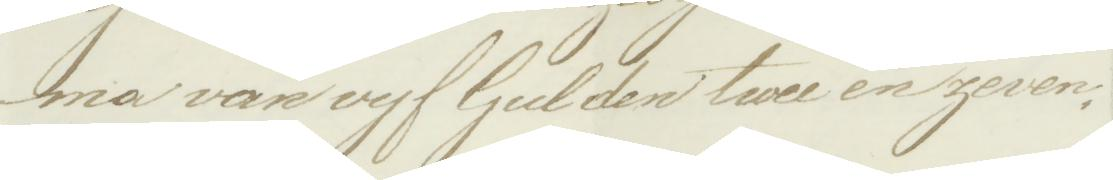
ma van vyf Gulden twee en zeven„
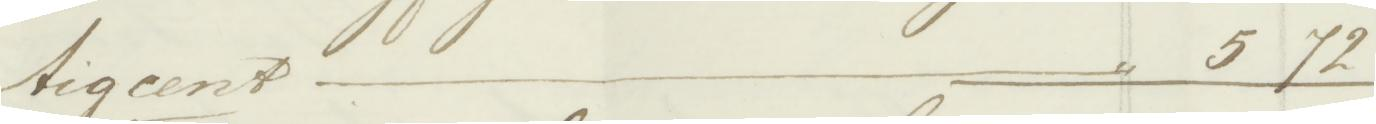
tig cent —„ 5 72
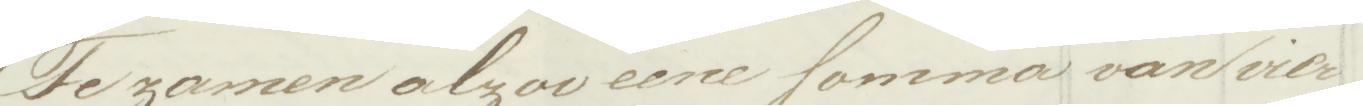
Te zamen alzoo eene somma van vier
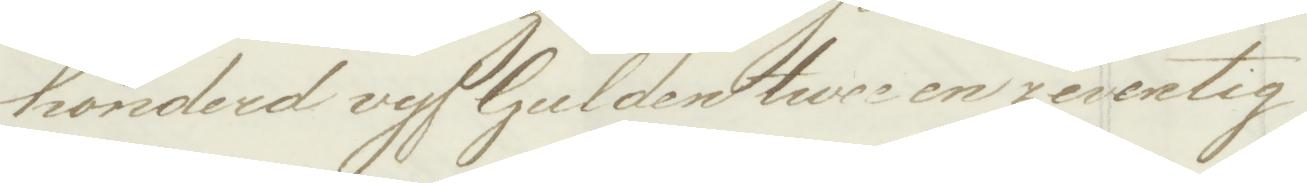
honderd vyf Gulden twee en zeventig
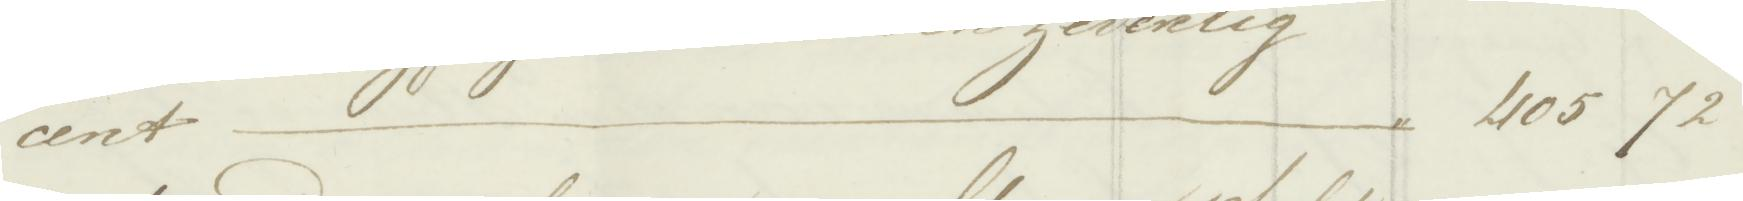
cent —„ 405 72
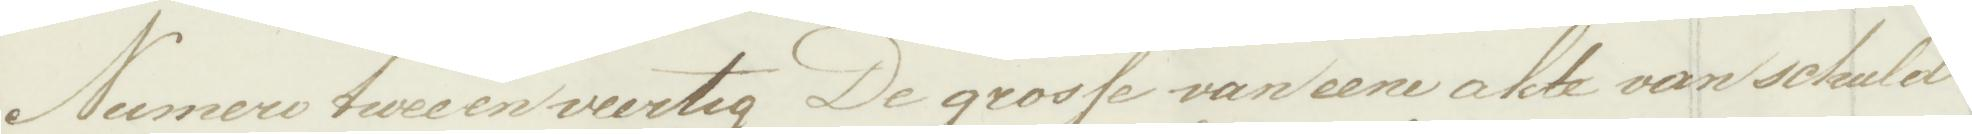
Numero twee en veertig De grosse van eene akte van schuld
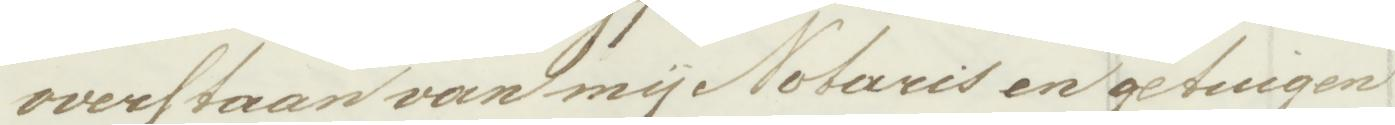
overstaan van my Notaris en getuigen
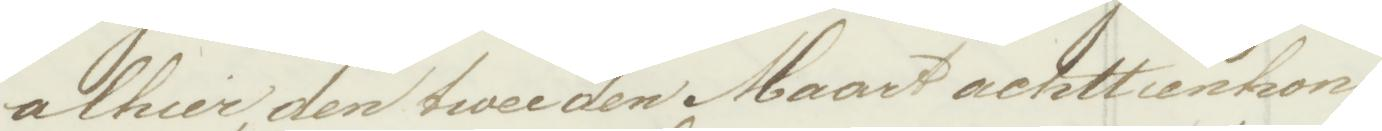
alhier, den tweeden Maart achttienhon
